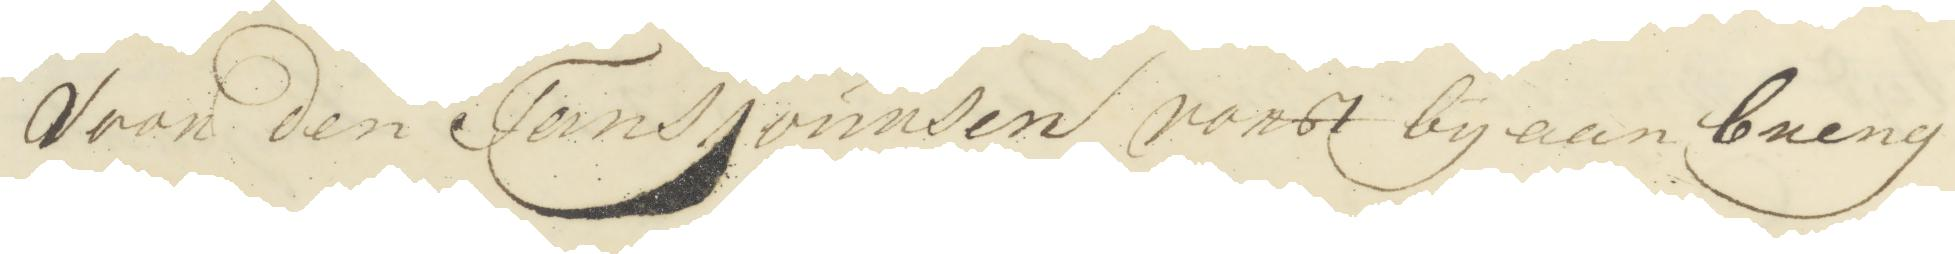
voor den Tansjoursen vorst bij aan breng
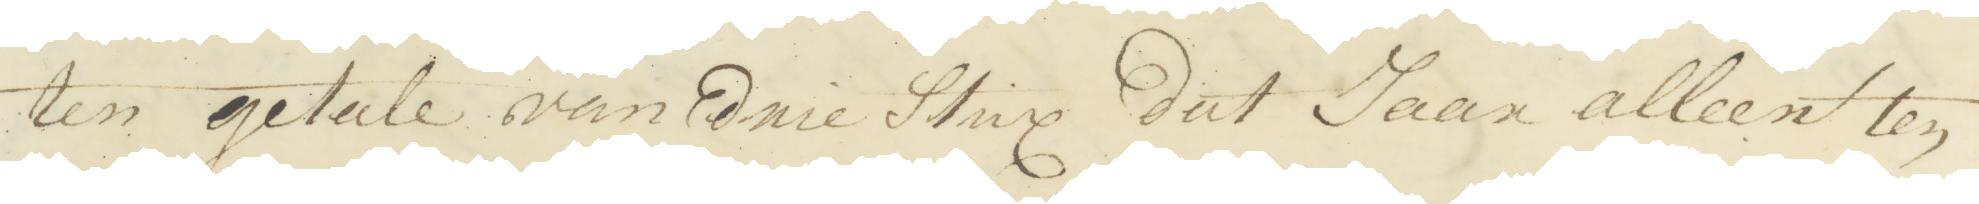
ten getale van drie stux dat Iaar alleen ten
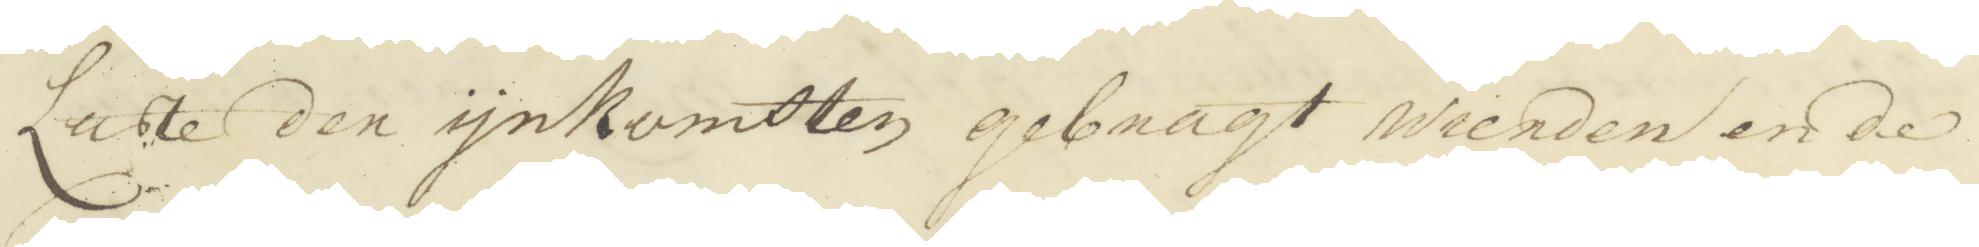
Laste der ijnkomsten gebragt wierden en de
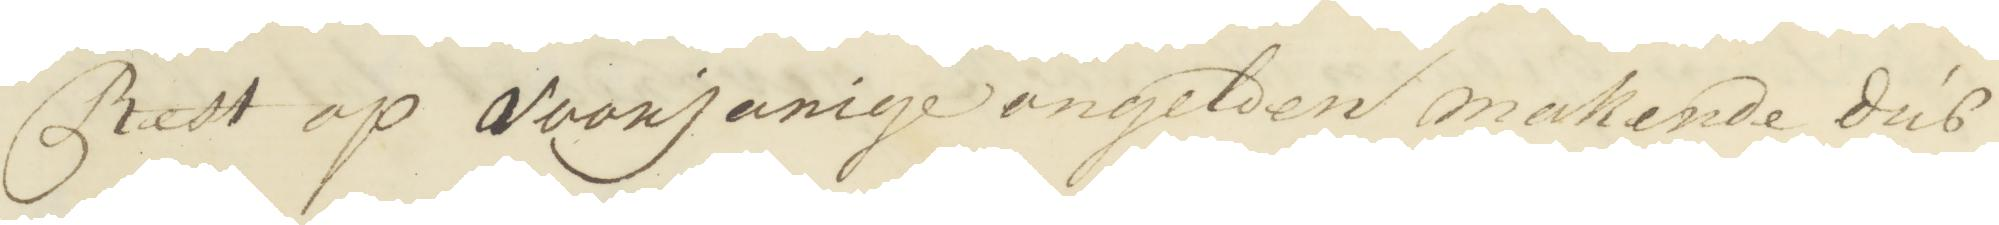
Rest op voorjarige ongelden makende dus
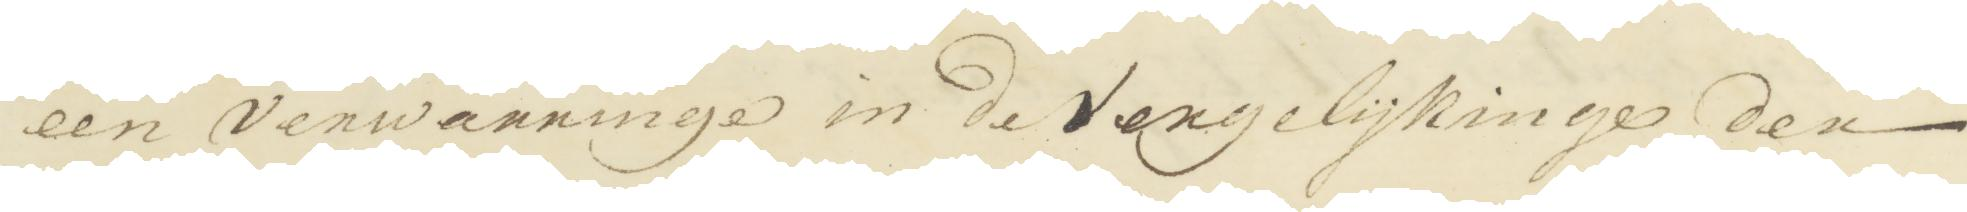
een verwarringe in de vergelijkinge der
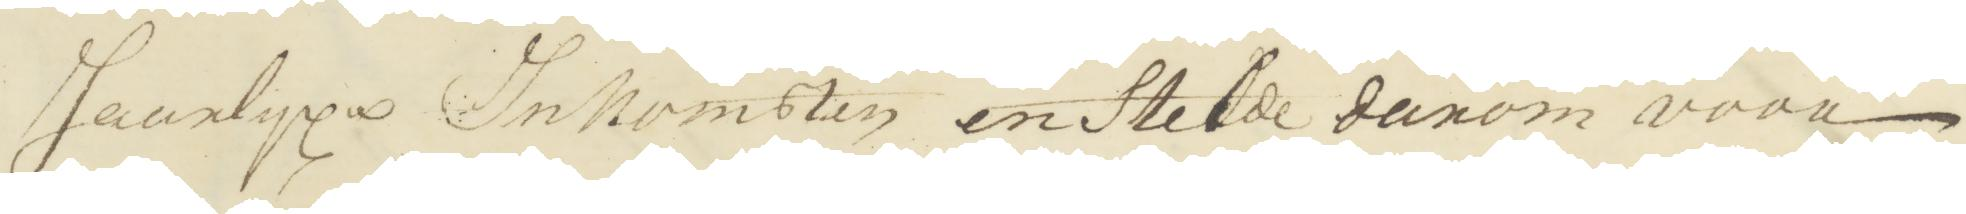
Jaarlijxe Inkomsten en stelde darom voor
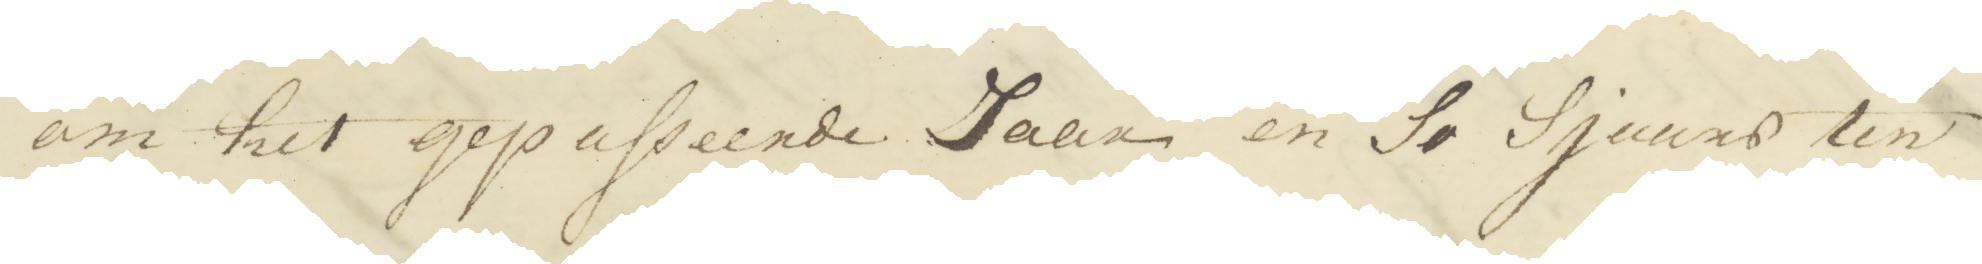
om het gepasseerde Iaar en so sjaars ten
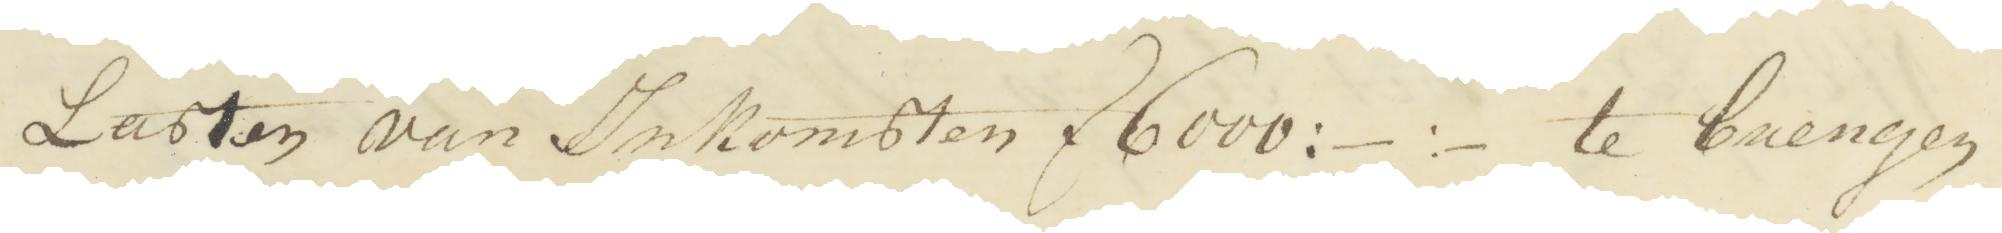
Lasten van Inkomsten ƒ6000: — :— te brengen
